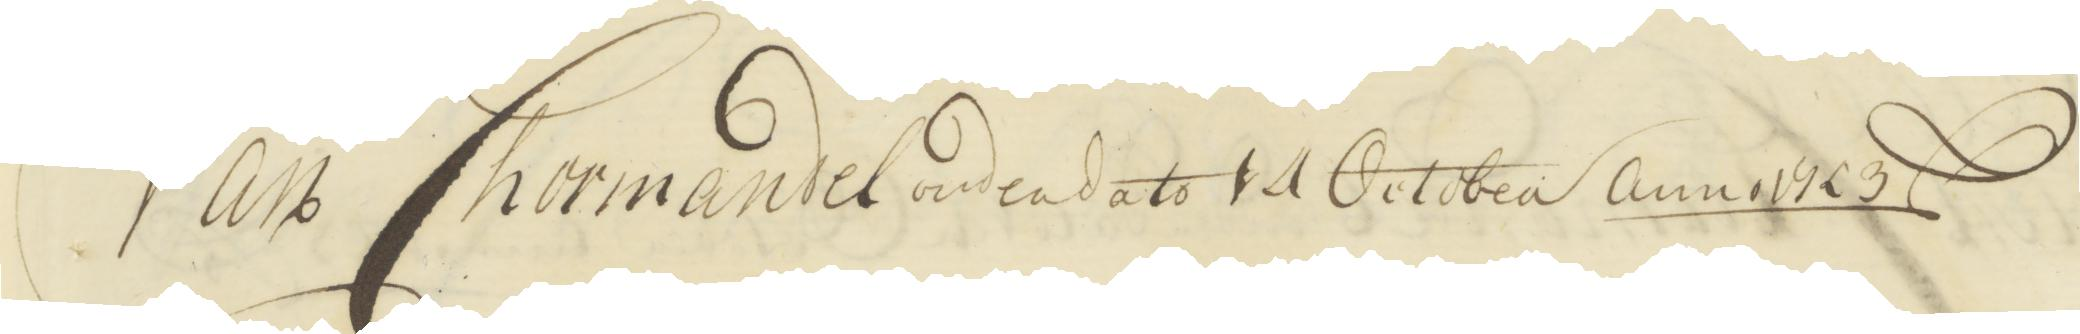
Van Chormandel onder dato 14 October Anno 1753
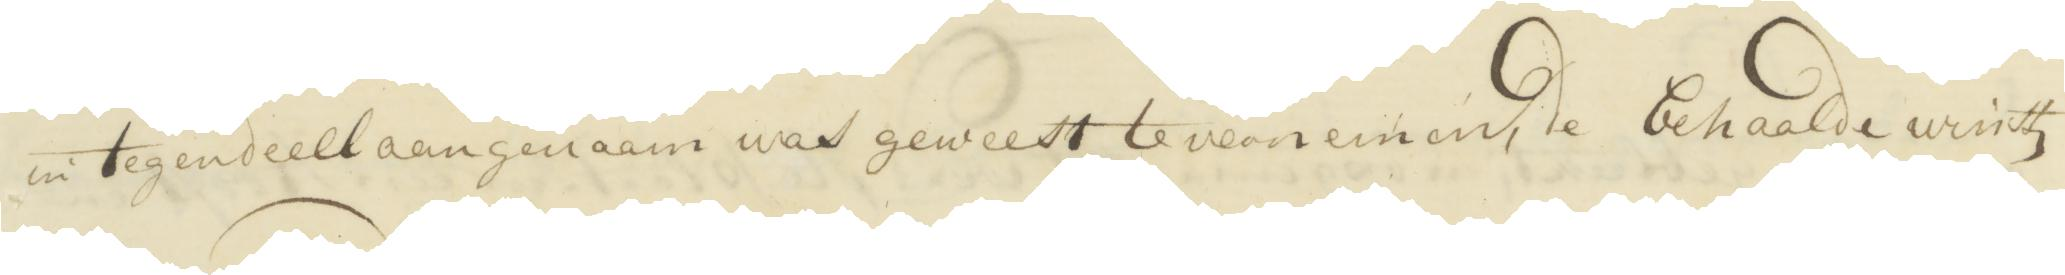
in tegendeell aangenaam was geweest te vernemen, de behaalde winsten
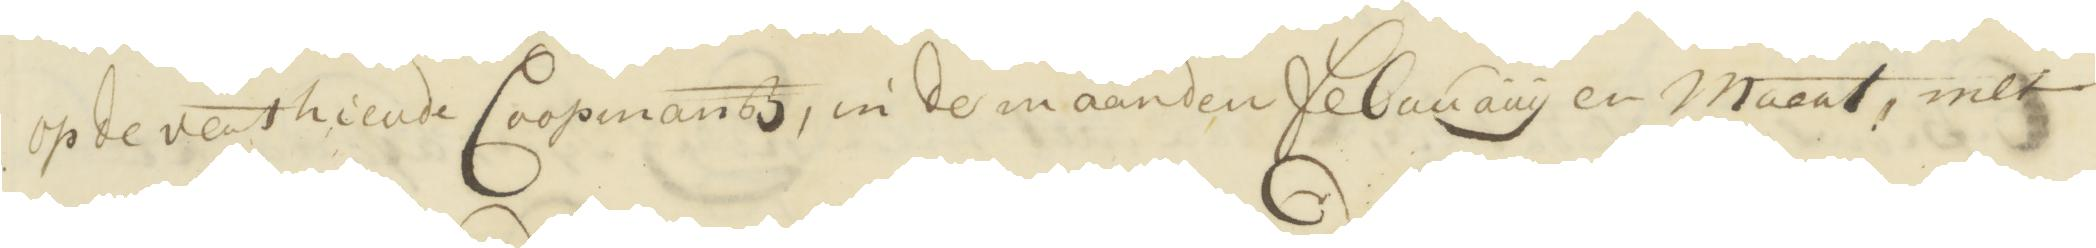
op de verthiende Coopmansz, in de maanden februarij en maart, met
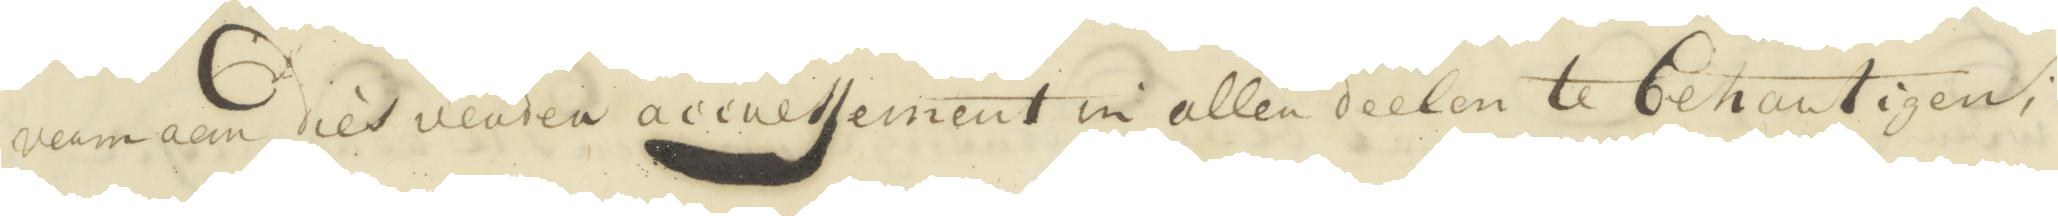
vermaan dies verder accressement in allen deelen te behartigen;
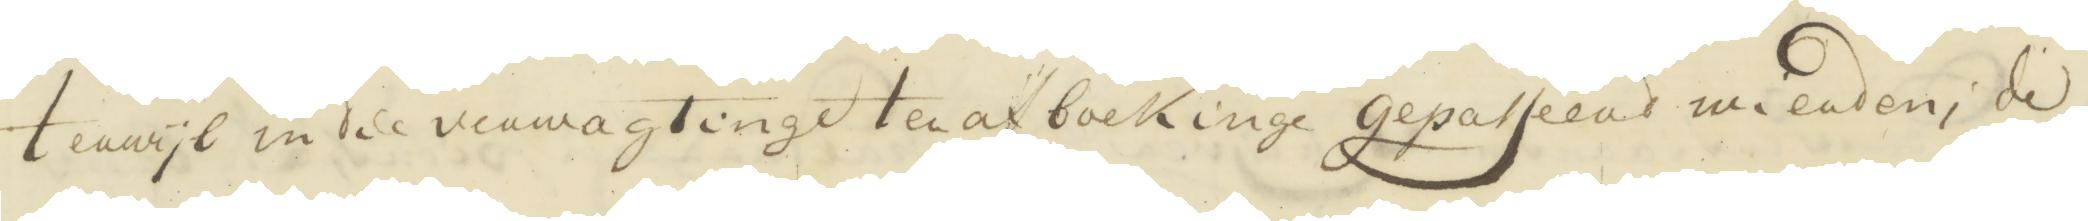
terwijl in de verwagtinge ter afboekinge gepasseerd wierden; de
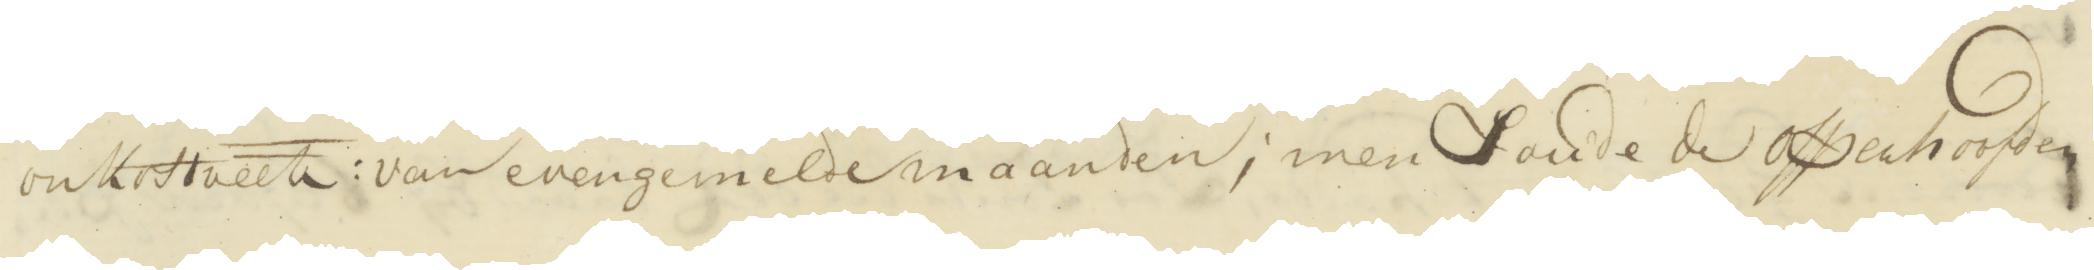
onkostreek: van evengemelde maanden; men Soude de opperhoofden
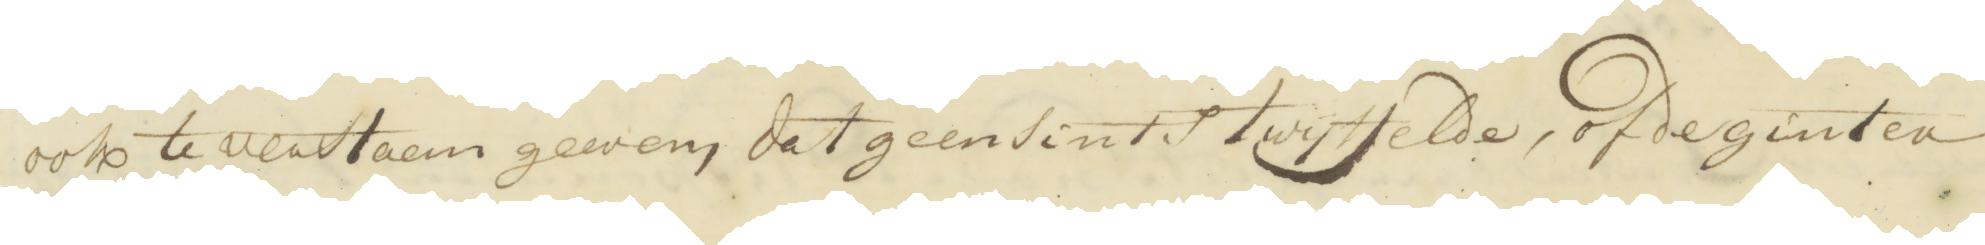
ook te verstaan geven dat geensints twijffelde, of de ginter
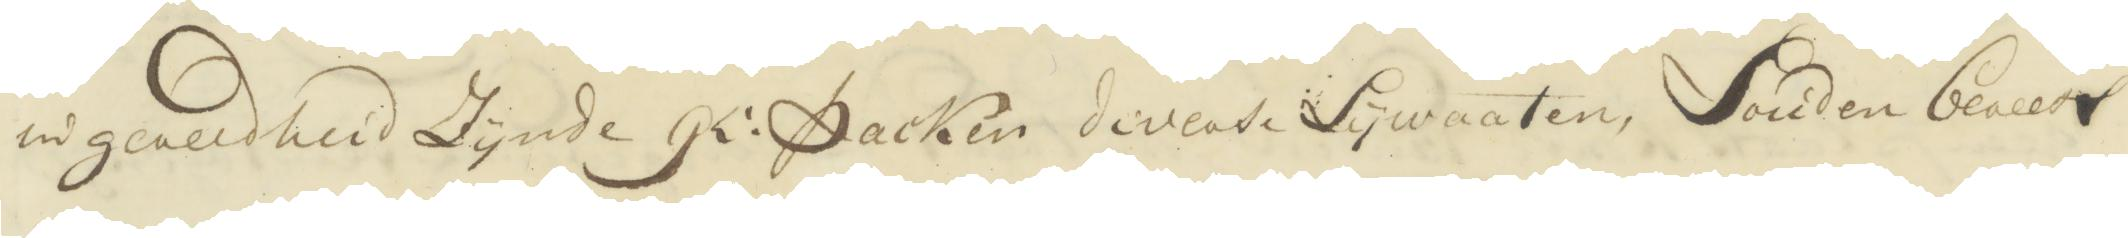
in gereedheid Zijnde 95. Packen diverse Lijwaaten, Souden bereets
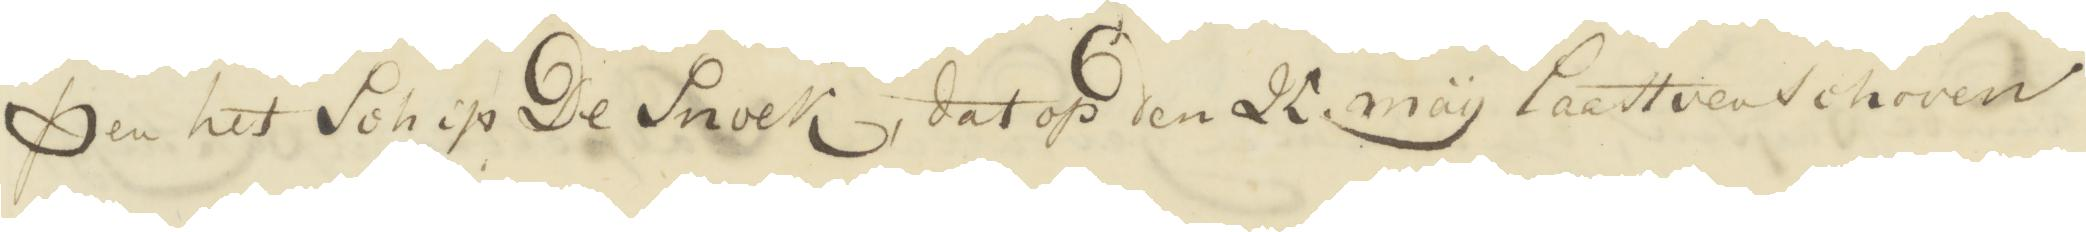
Per het Schip De Snoek, dat op den 25. maij laast verschoven
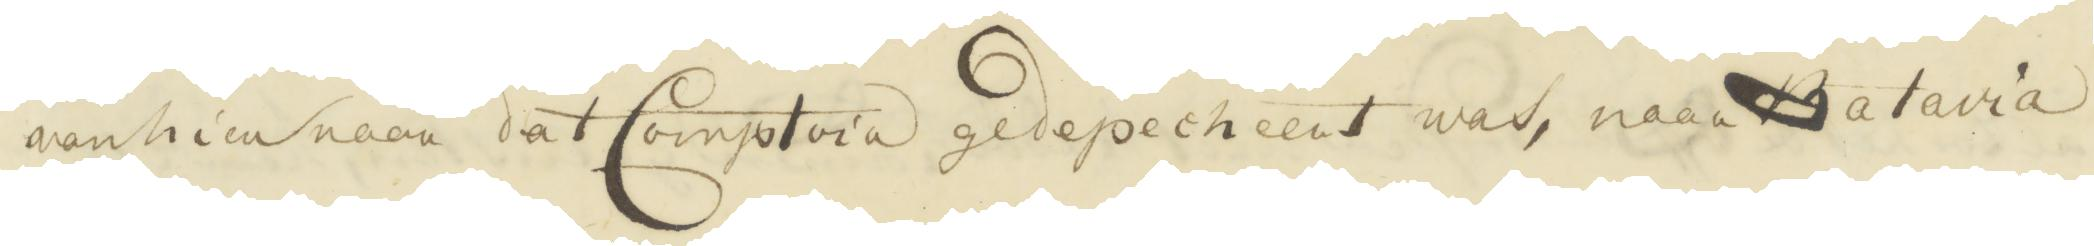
van hier naar dat Comptoir gedepecheert was, naar Batavia
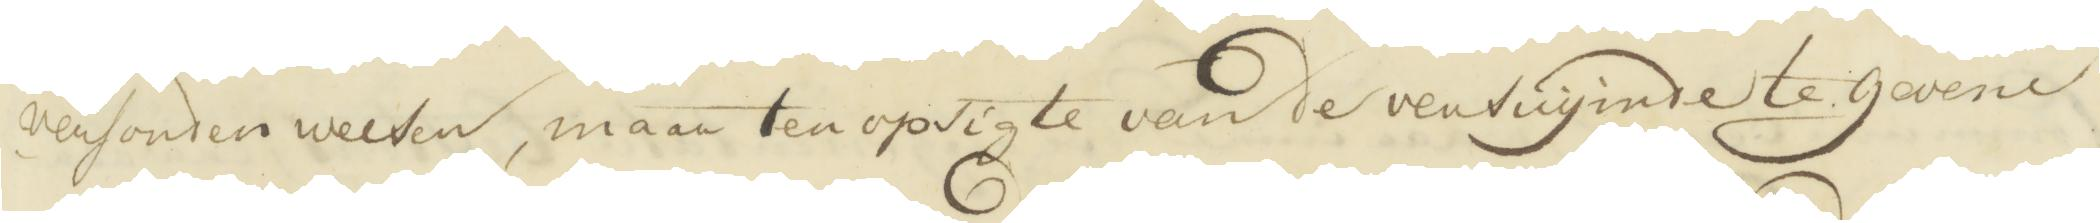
versonden weesen, maar ten opsigte van de versuijmde te gevene
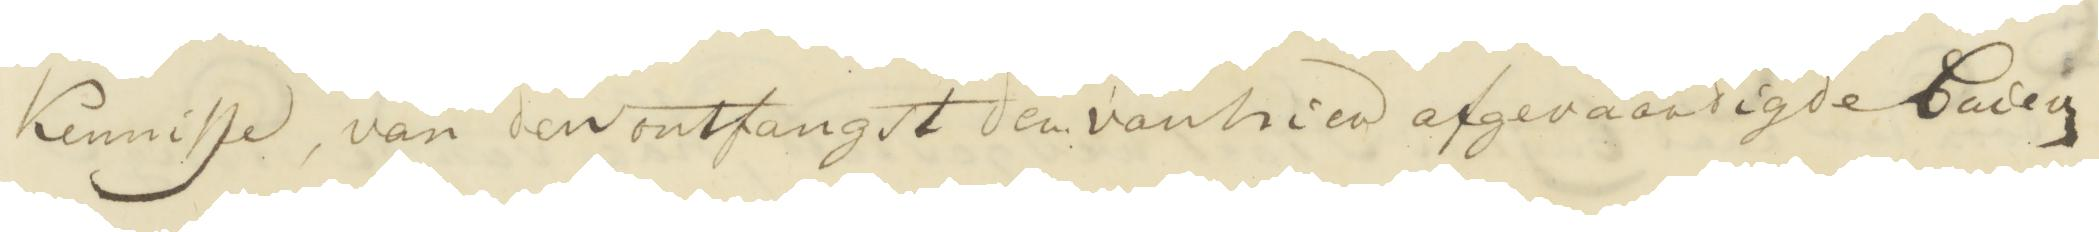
kennisse, van den ontfangst den van hier afgevaardigde bacen
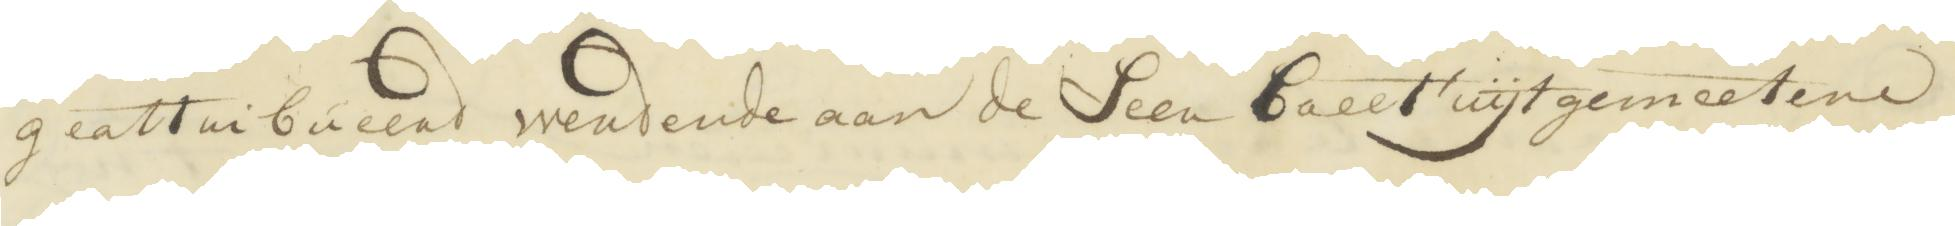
geattribueerd werdende aan de Seer breet uijtgemeetene
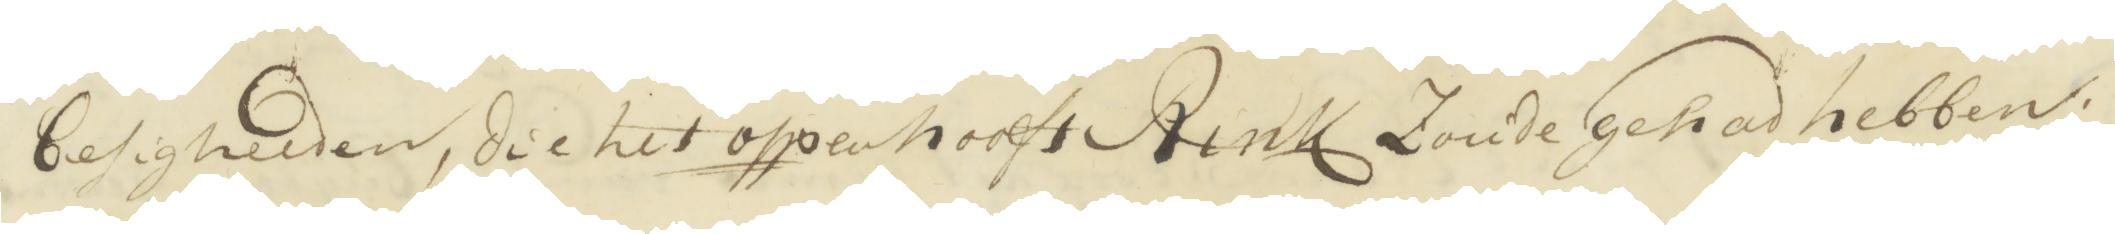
besigheeden, die het opperhooft Rink Zoude gehad hebben;
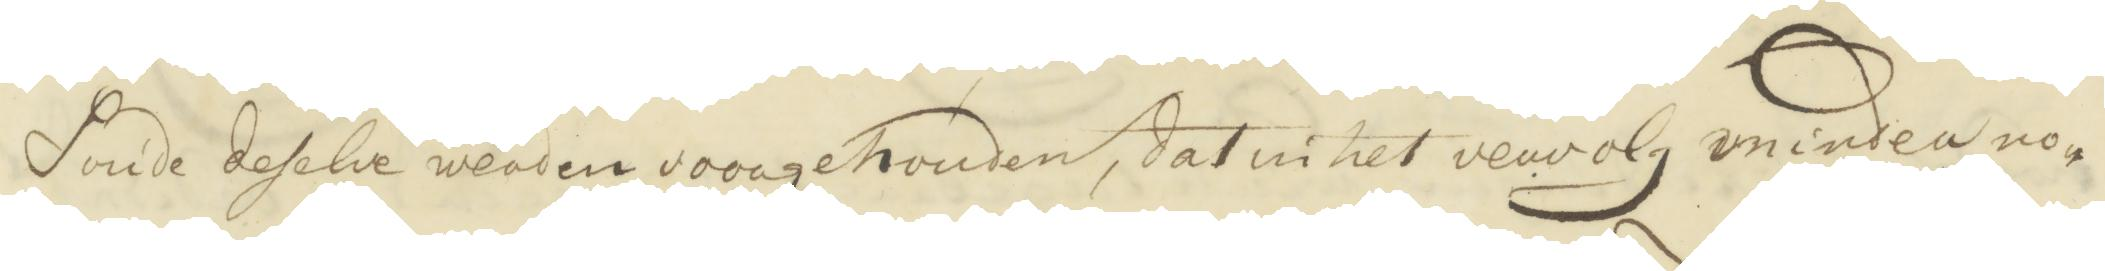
Soude deselve werden voorgehouden, dat in het vervolg minder no
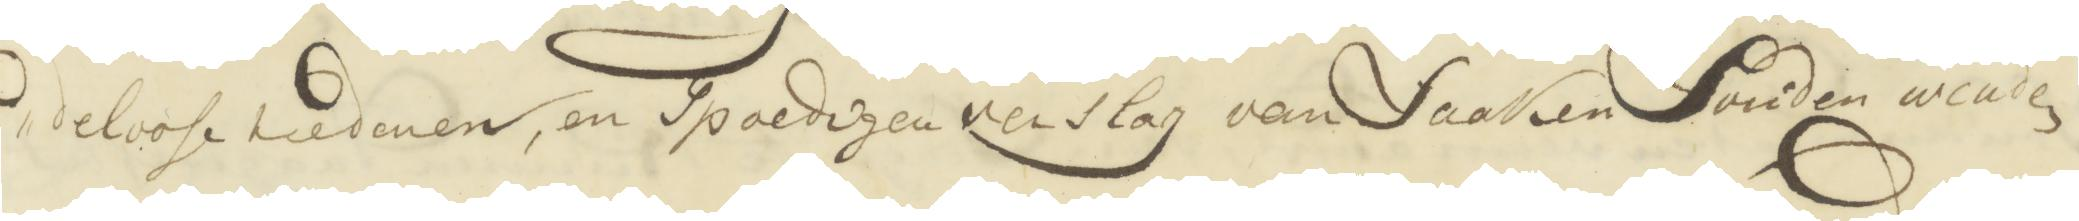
„deloose redenen, en Spoediger verslag van Saaken Souden werden
